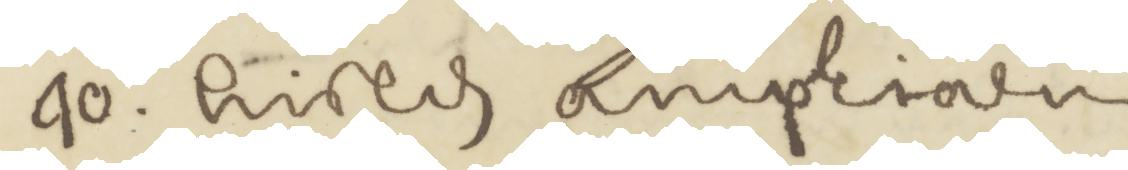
40. kisten amphioen
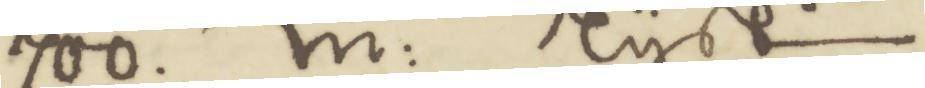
700. m: rijst
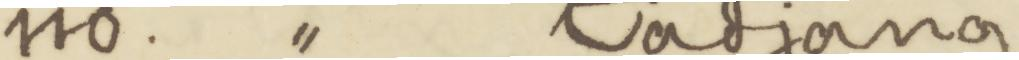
110. „ Cadjang
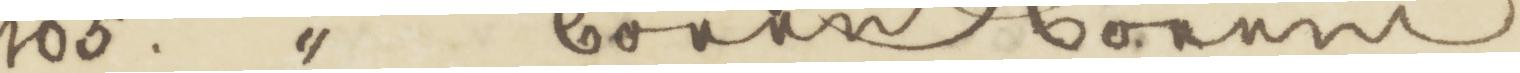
105. „ borrie borrie
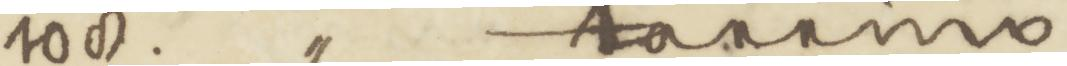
108. „ tarruw
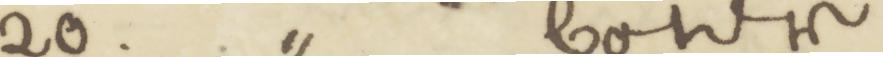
20. „ boter
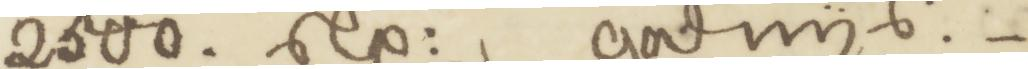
2500. stx: goenijs. —
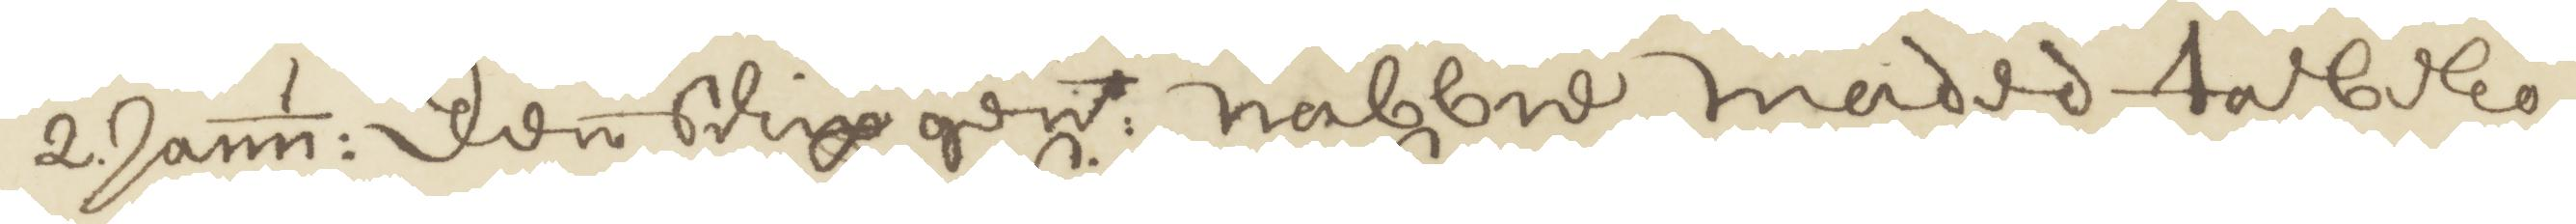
2. Janu: Een schip gen:t Nabbie Maded toebeho
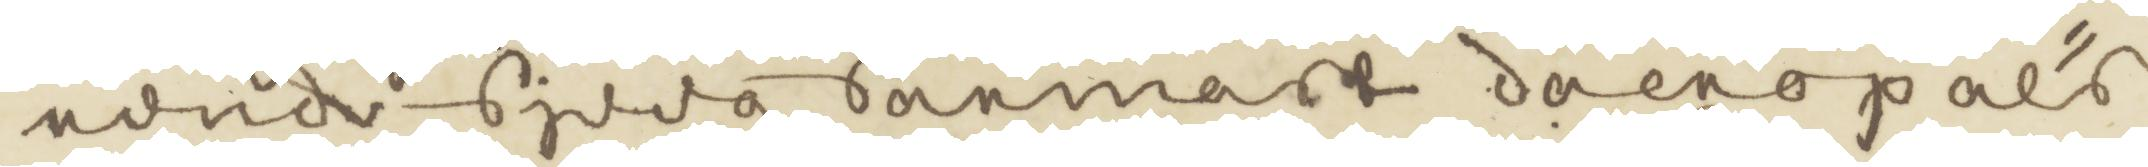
rende sjeeg sarmast daerop als
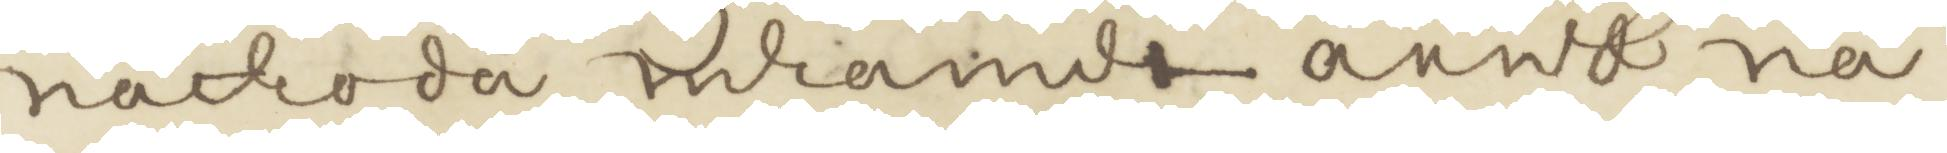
nachoda Mhamet arief na
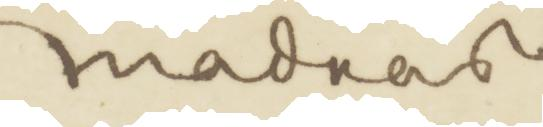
Madras
